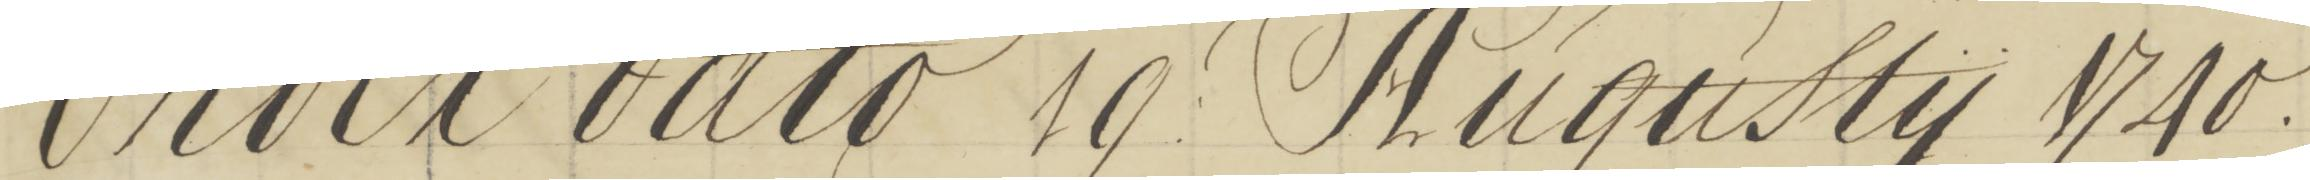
Onder dato 19:' Augustij 1740.
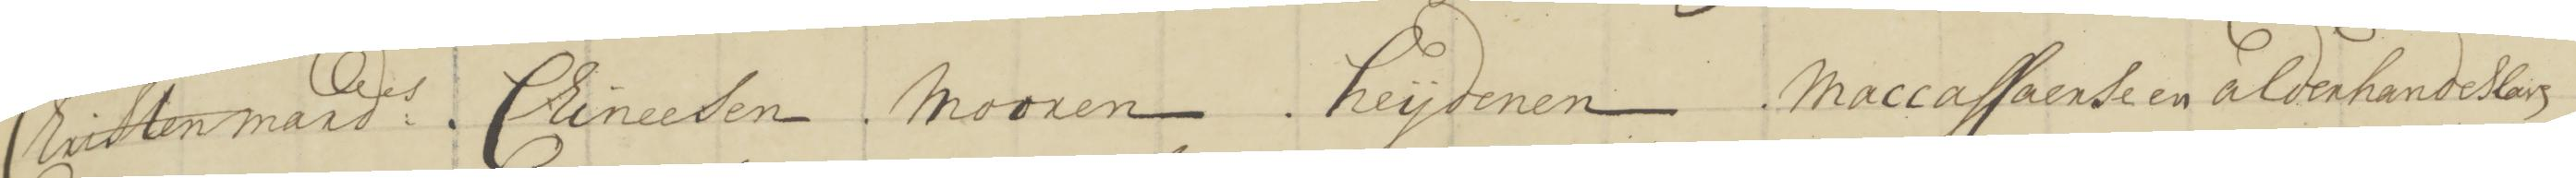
Christen mard:s Chineesen. Mooren. heijdenen. Maccassaerse en alderhandeslaven
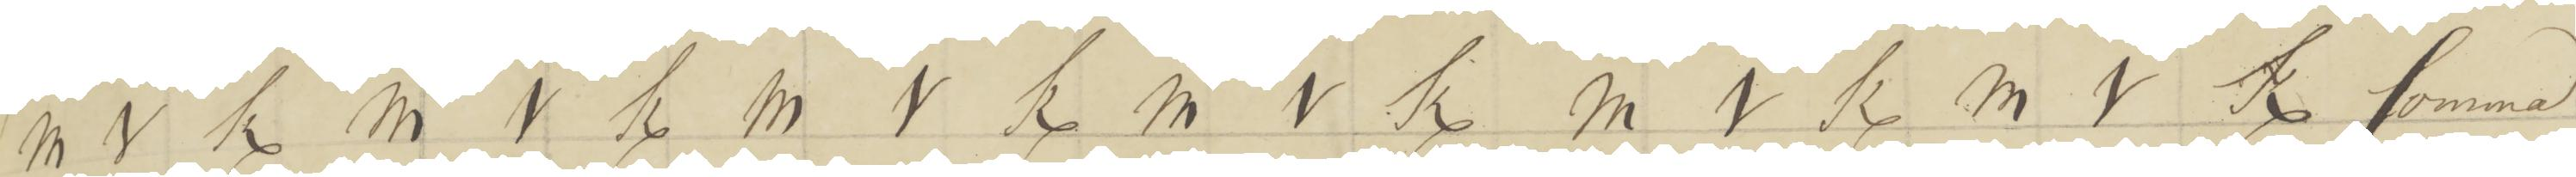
m v k m v k m v k m v k m v k m v k somma
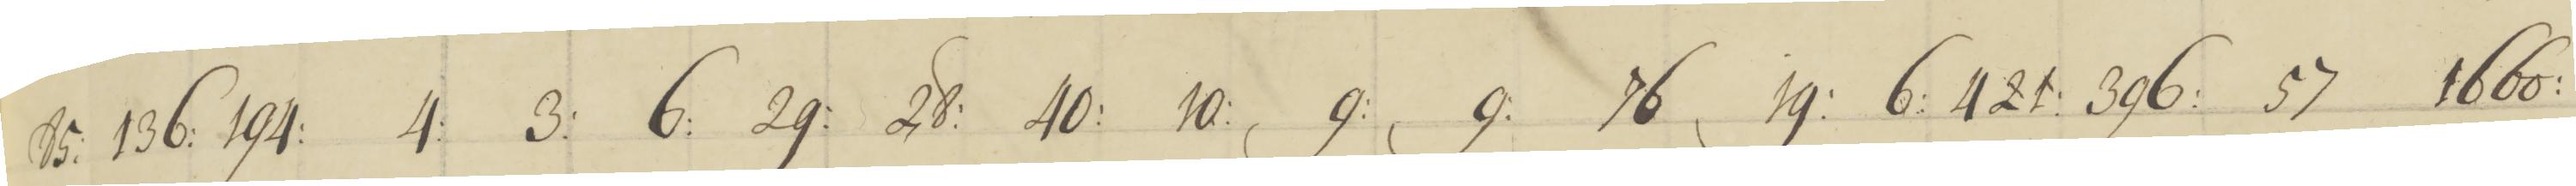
85: 136: 194: 4: 3: 6: 29: 28: 40: 10: 9: 9: 76 19: 6: 421: 396: 57 1660:
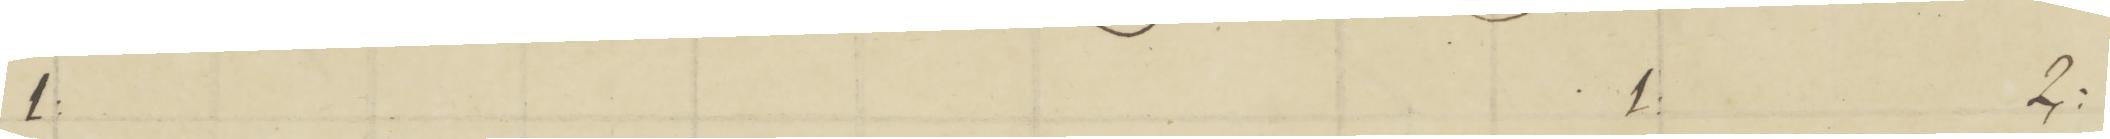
1: 1: 2:
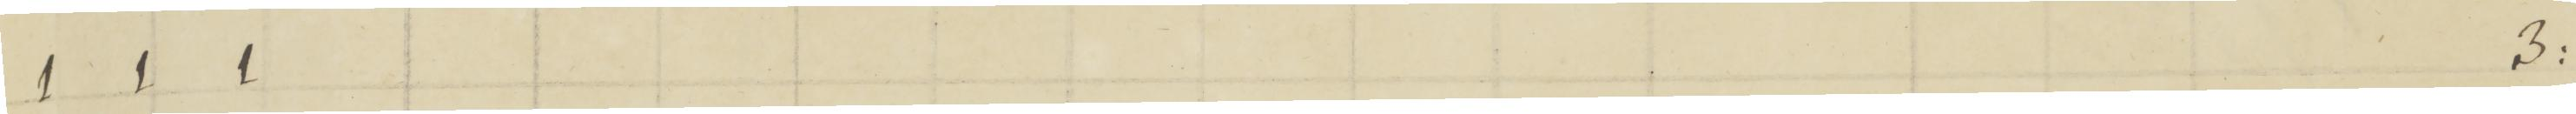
1 1 1 3:
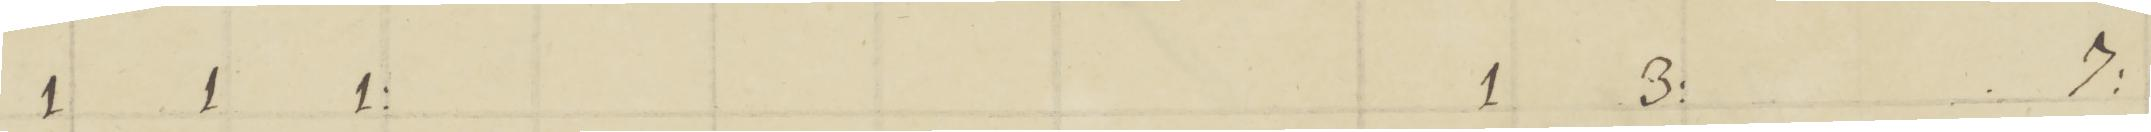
1 1 1: 1 3: 7:
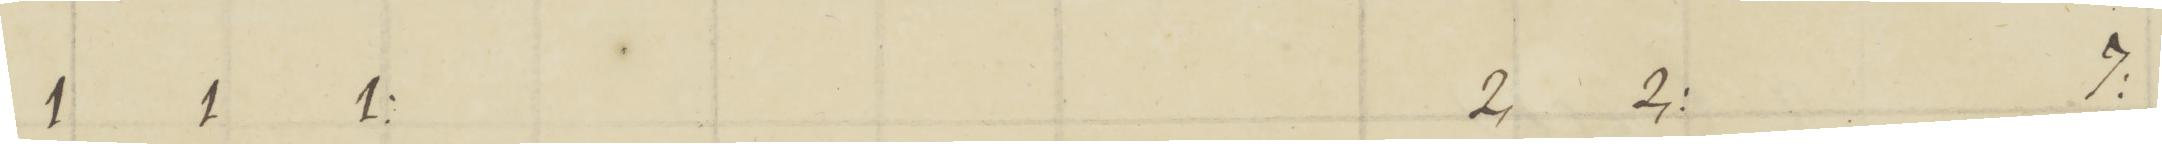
1 1 1: 2 2: 7:
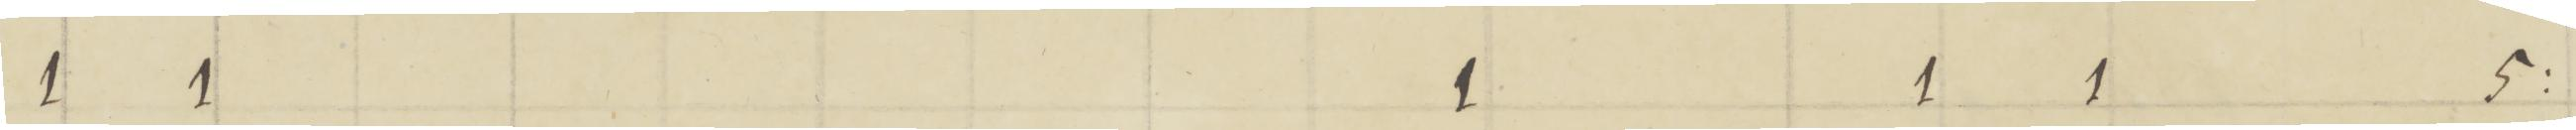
1 1 1 1 1 5:
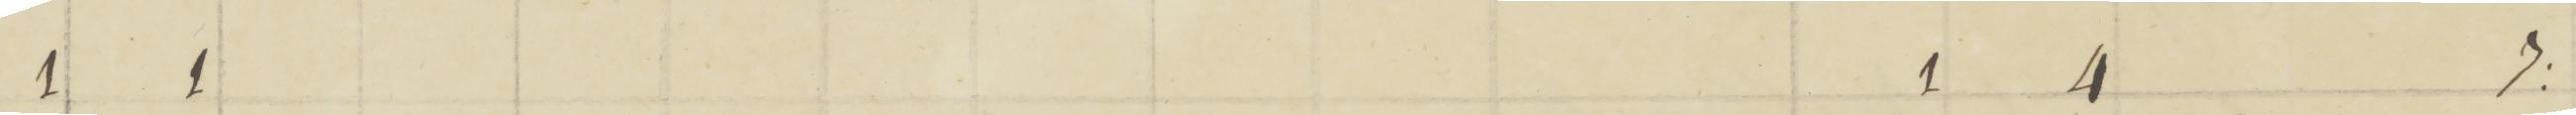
1 1 1 4 7:
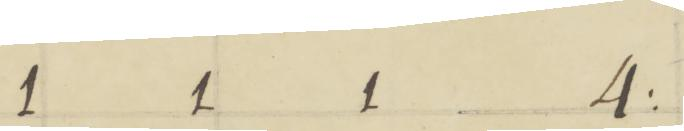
1 1 1 4:
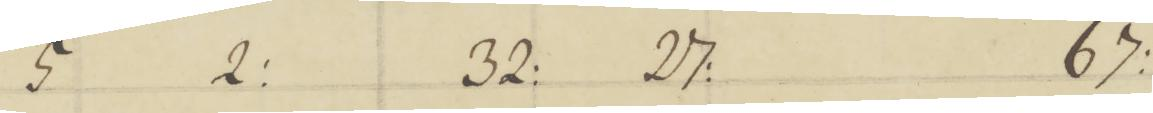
5 2: 32: 27: 67:
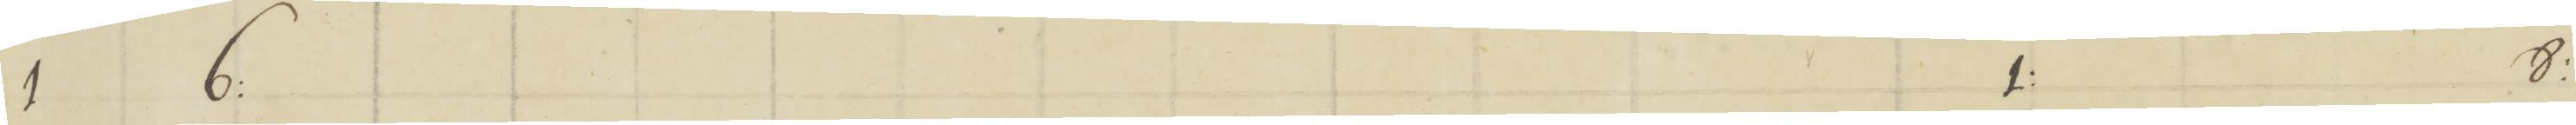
1 6: 1: 8:
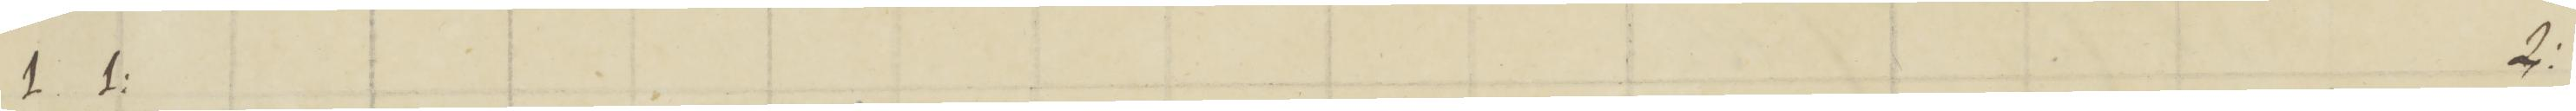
1 1: 2.
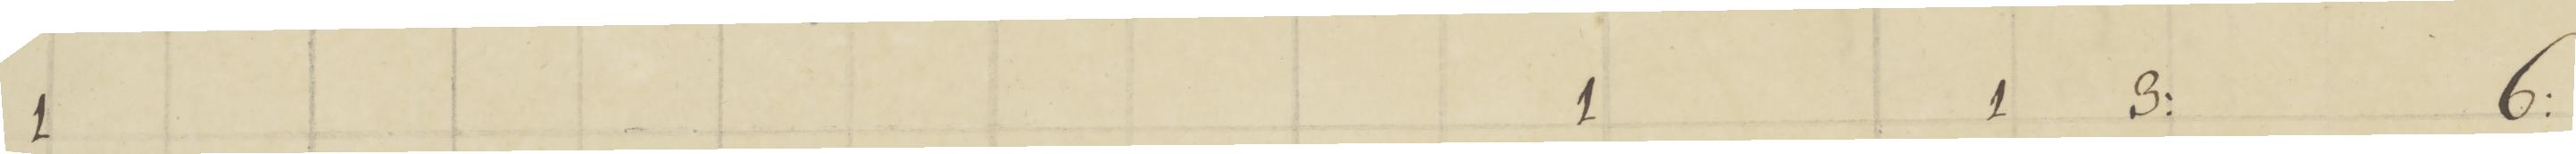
1 1 1 3: 6:
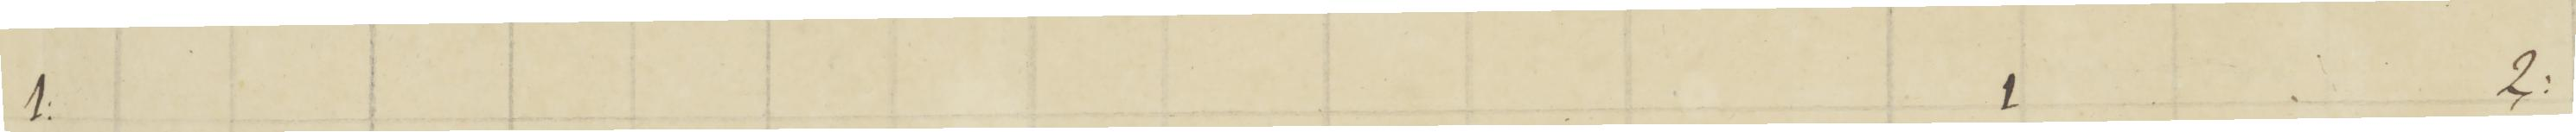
1: 1 2:
